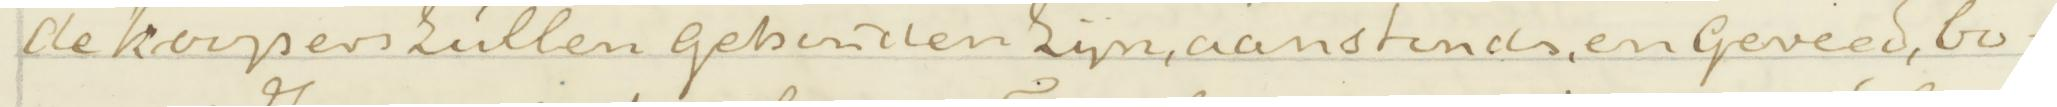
de koopers zullen gehouden zijn, aanstonds en Gereed, bo=
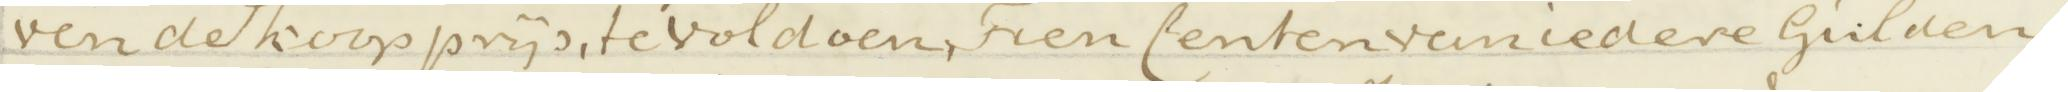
ven de koopprijs, te voldoen, Tien Centen van iedere Gulden,
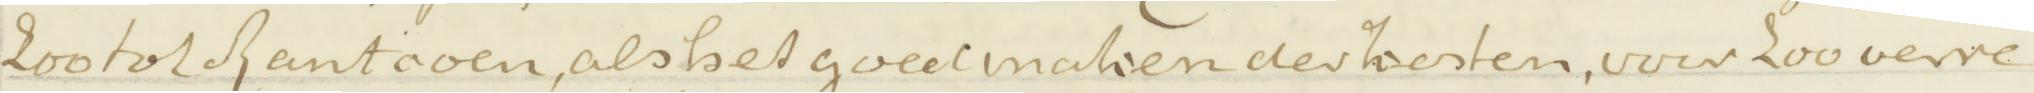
zoo tot Rantcoen, als het goedmaken der kosten, voor zoo verre
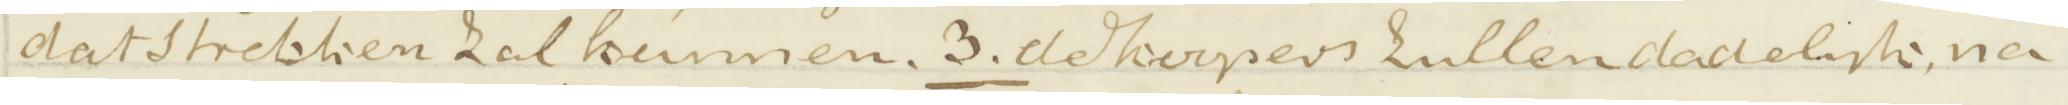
dat strekken zal kunnen. 3. dekoopers zullen dadelyk, na
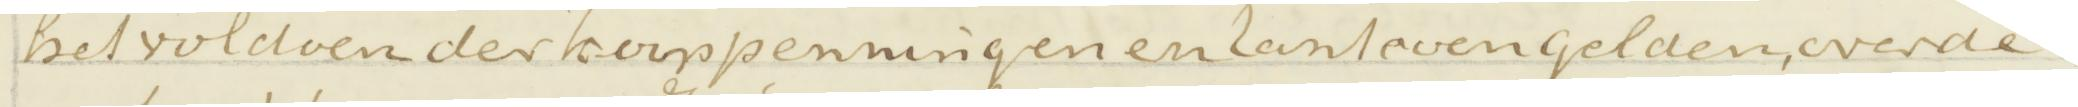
het voldoen der kooppenningen en rantcoen gelden, overde
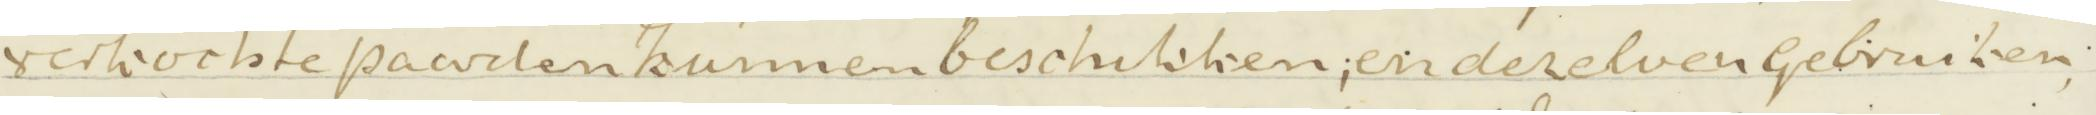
verkochte paarden kunnen beschikken; en dezelven Gebruiken
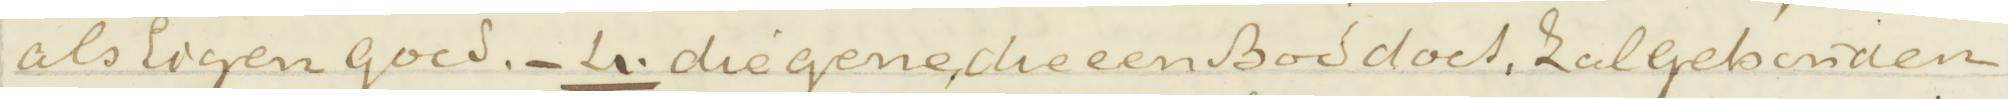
als Eigen goed. - 4. die gene, die een Bod doet, zal gehouden
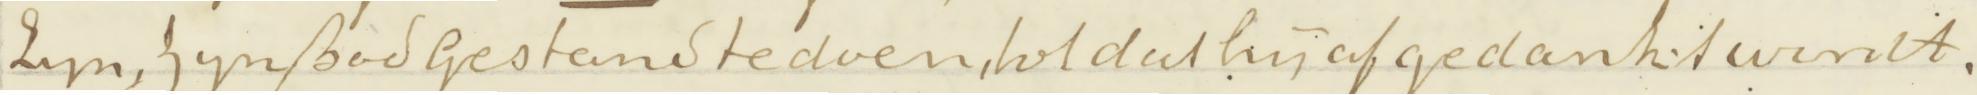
zyn, zyn Bod Gestand te doen, tot dat hij afgedankt wordt
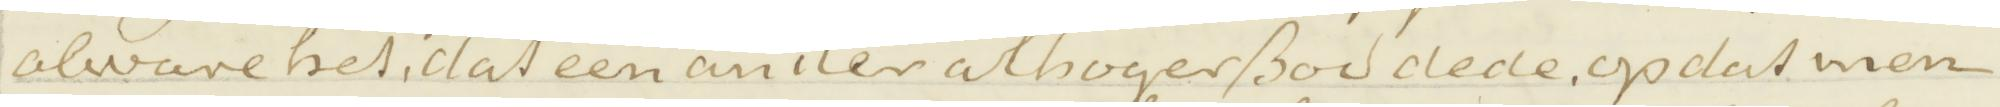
alware het, dat een ander alhoger Bod dede op dat men
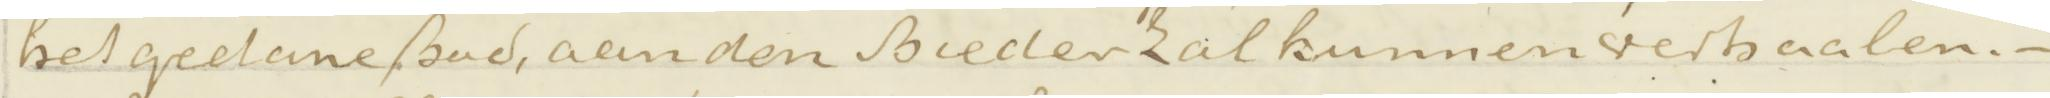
het gedane Bod, aan den Bieder zal kunnen verhaalen.-
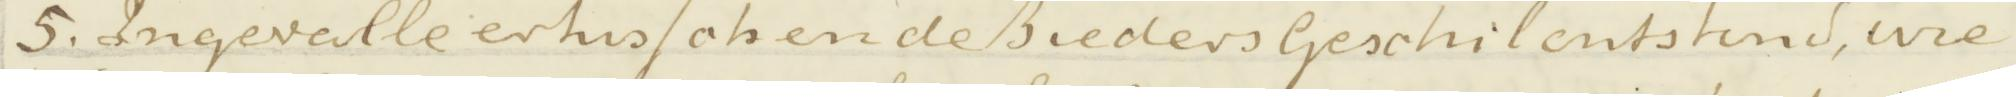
5. Ingevalle ertusschen de Bieders Geschil ontstond, wie
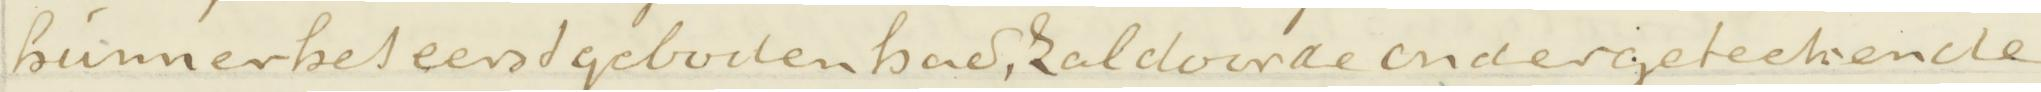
hunner het eerst geboden had, zal door de ondergeteekende
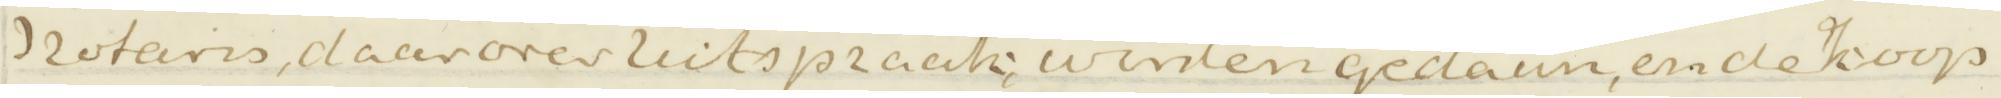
Notaris, daarover uitspraak worden gedaan, en de koop
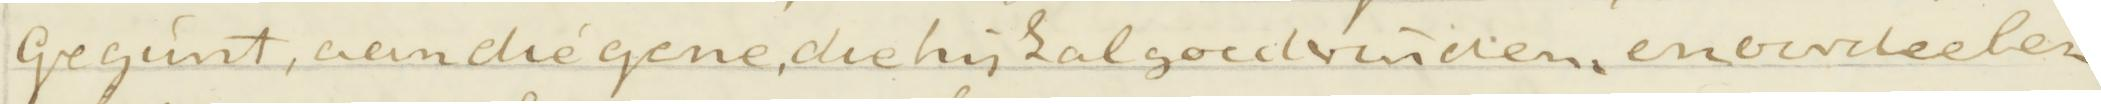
gegunt, aan die gene, die hij zal goedvinden, en oordeelen
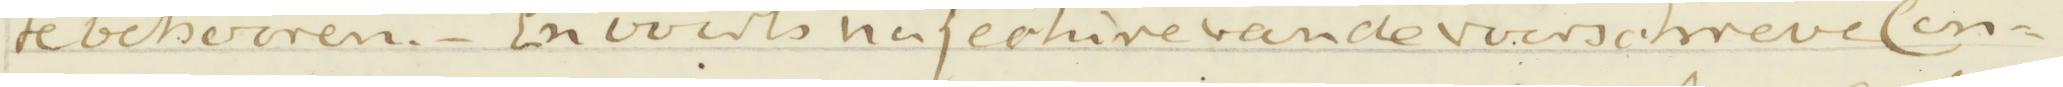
te behooren.- En voorts na Lecture van de voorschreve Con=
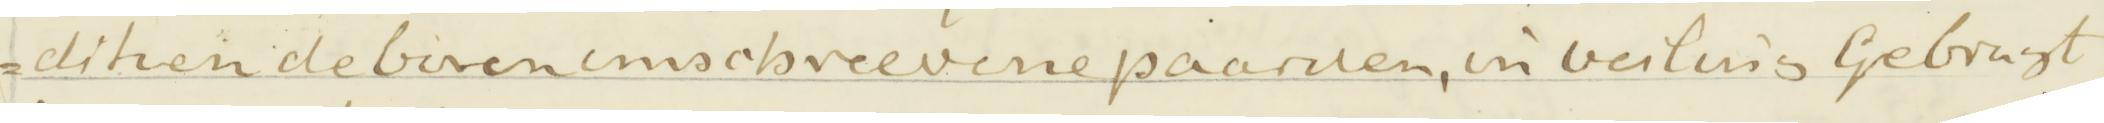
=ditien de boven omschreevene paarden, in veiling Gebragt
